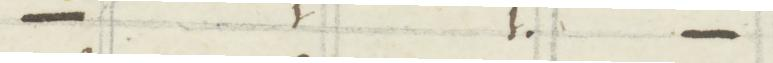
— 1 1. —
